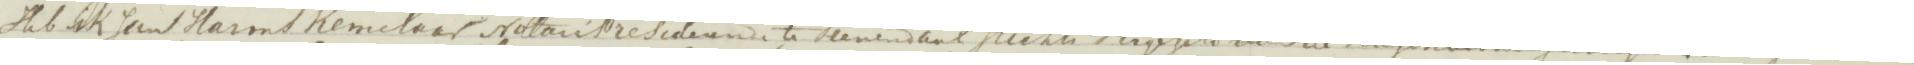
Heb ik Jan Harms Kemelaar Notaris residerende te Veenendaal Stichts vergezeld van de nagenoemde getuigen ten verzoeke van de
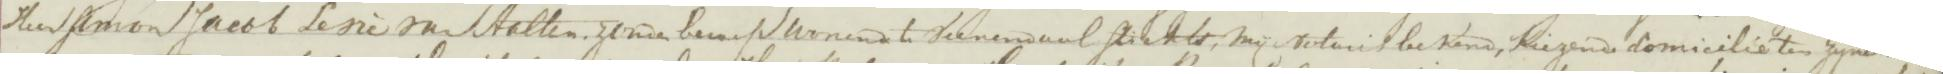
Heer Simon Jacob Levie van Aalten, zonder beroep wonend te Veenendaal Stichts, mij Notaris bekend, kiezend domicilie ten zijnen hui
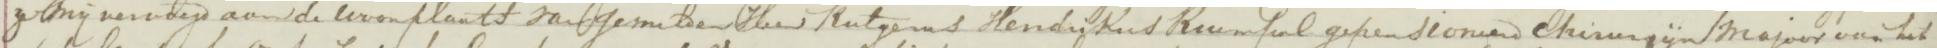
ze mij vervoegd aan de woonplaats van gemelden Heer Rutgerus Hendrikus Ruempol gepensioneerd Chirurgijn Majoor van het
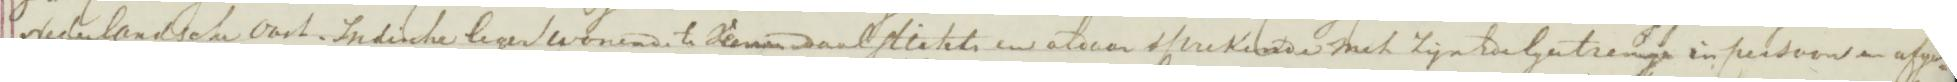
Nederlandsche Oost- Indische leger wonende te Veenendaal Stichts en aldaar sprekende met zijn Ede Gestrenge in persoon en afge
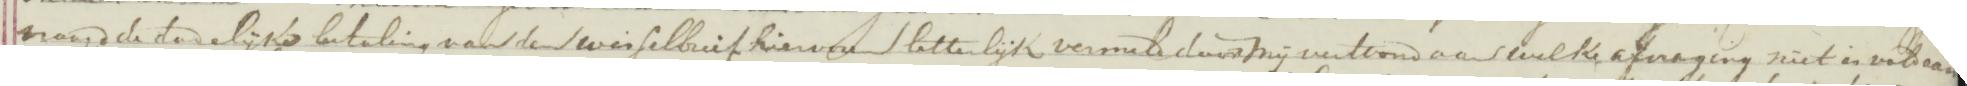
vraagd de dadelijke betaling van den wisselbrief hiervoor letterlijk vermeld door mij vertoond aan welke afvraging niet is voldaan
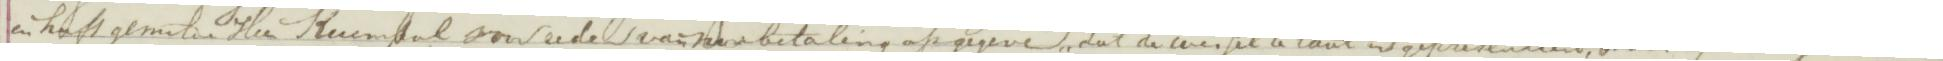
en heeft gemelde Heer Kuempol voor reden van nonbetaling opgegeven, dat de wissel te laat is gepresenteerd, dat hij de den zestienden
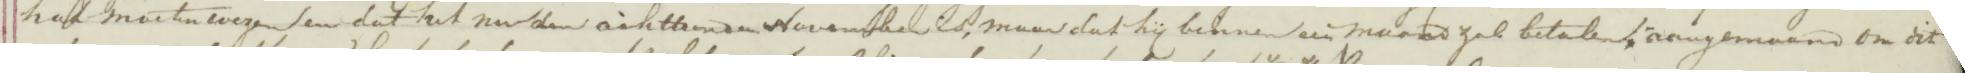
had moeten wezen en dat het nu den achttienden November is, maar dat hij binnen een maand zal betalen, aangemaand om dit
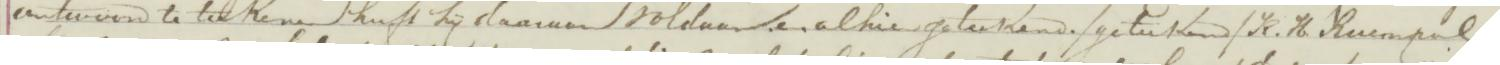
antwoord te teekenen heeft bij daaraan Voldaan en alhier geteekend./ geteekend / R. H. Ruempol
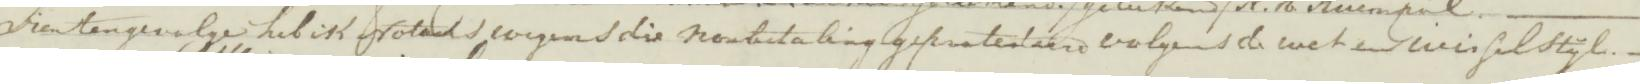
Dien tengevolge heb ik Notaris, wegens die nonbetaling geprotesteerd volgens de wet en wisselstijl.
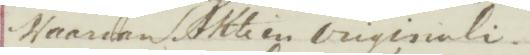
Waarvan Aktien Originali.
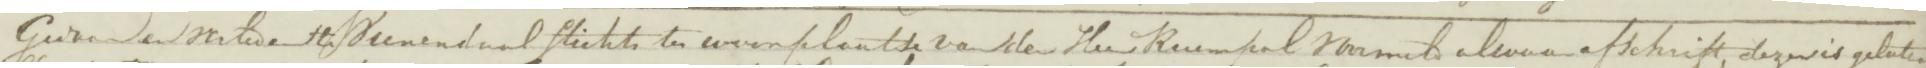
Gedaan en verleden te Veenendaal Stichts ter woonplaatse van den Heer Ruempol Voormeld alwaar afschrift, dezes is gelaten
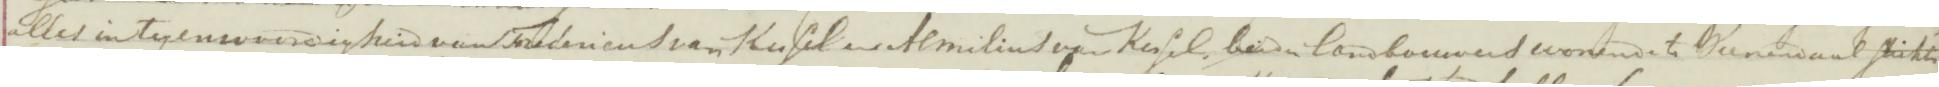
alles integenwoordigheid van Fredericus van Kessel en Aemilius van Kessel, beiden landbouwers wonende te Veenendaal Stichts
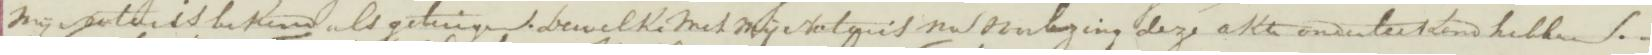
mij Notaris bekend als getuigen dewelke met mij Notaris na voorlezing deze akte onderteekend hebben.
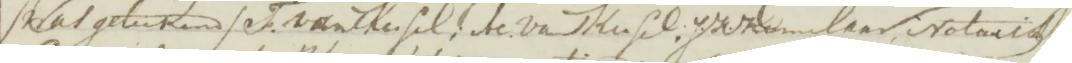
/was geteekend/ F. van Kessel, Ae van Kessel, JK Kemelaar, Notaris.
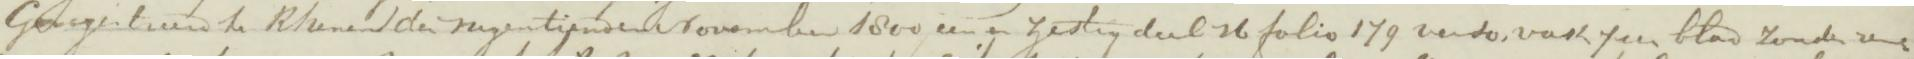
Geregistreerd te Rhenen den negentienden November 1800 een en Zestig deel 16 folio 179 verso, vak 7 een blad zonder ren
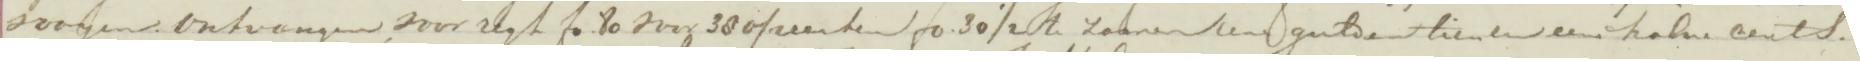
vooyen ontvangen voor regt ƒ0.80 voor 38 opcenten ƒ0.30½ te zamen Een gulden tien en een halve cents.
